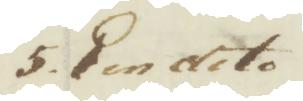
5. Een dito
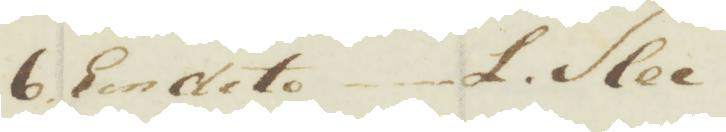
6. Een dito _ L. Slee
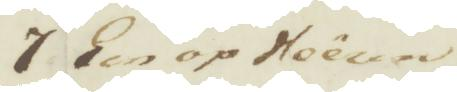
7 Een op stoëzen
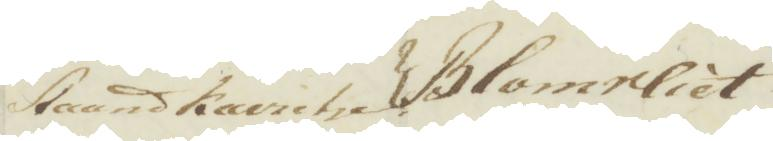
staand karretje E Blomvliet
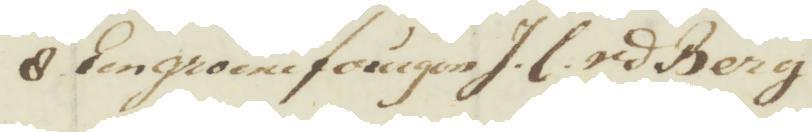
8. Een groene fourgon J. C. vd Berg
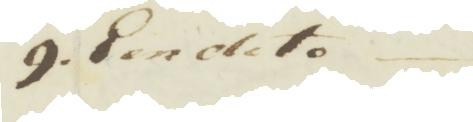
9. Een dito _
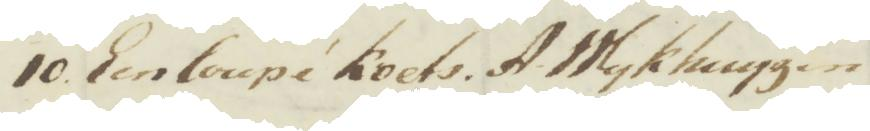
10. Een Coupé koets. A. Wykhuygen
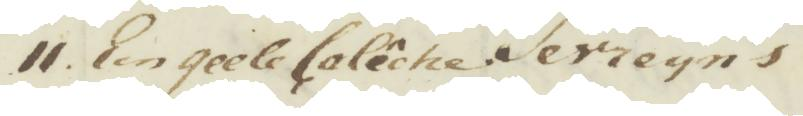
11. Een geele Calêche Sevreyns
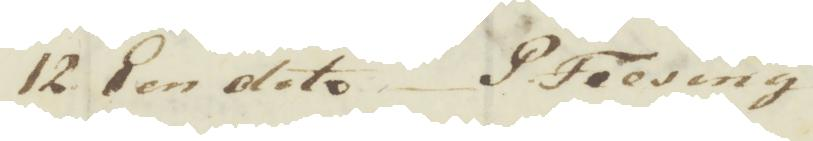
12 Een dito _ P. Feesing
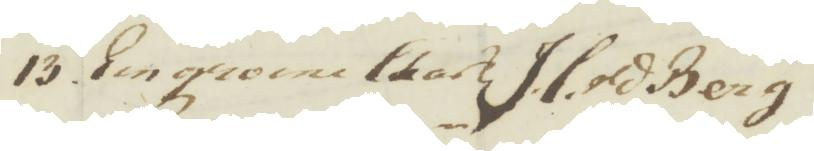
13. Een groene thar J. C. vd Berg
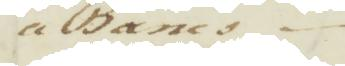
a Banes-
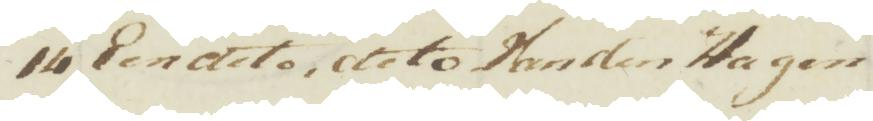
14 Een dito, dito Van den Hagen
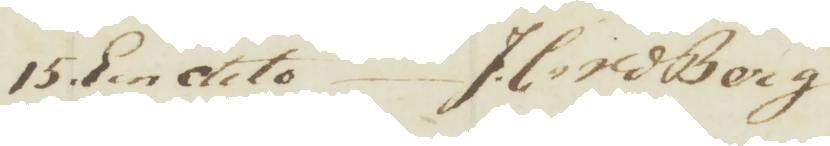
15. Een dito _ J.C. vd Berg
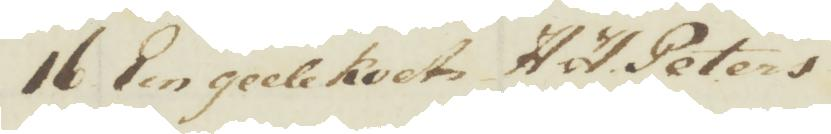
16 Een geele koets H J. Peters
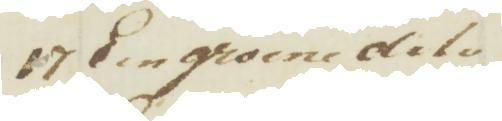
17 Een groene dito
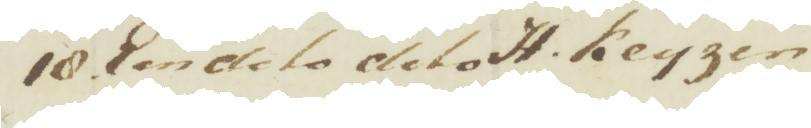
18. Een dito dito H. Keyzer
